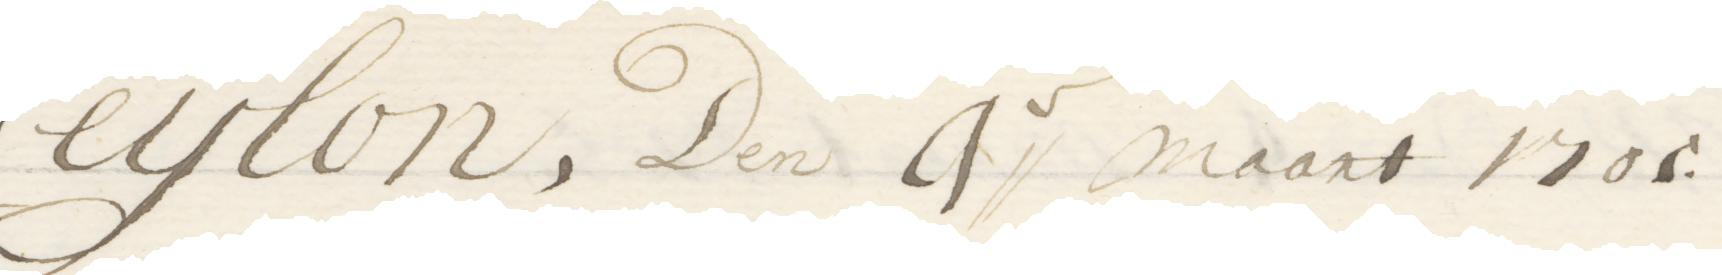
Ceijlon, Den 4„e Maart 1705.
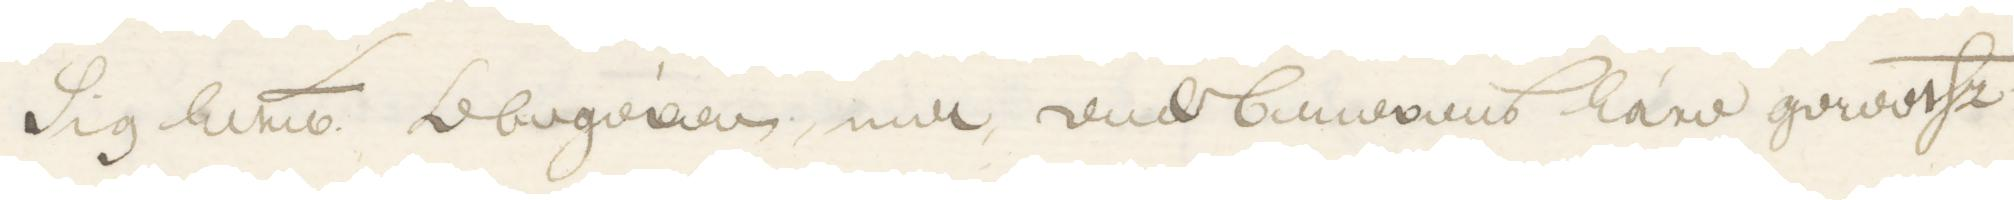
sig herw: te begeven, met, ende benevens hare gereetsz:
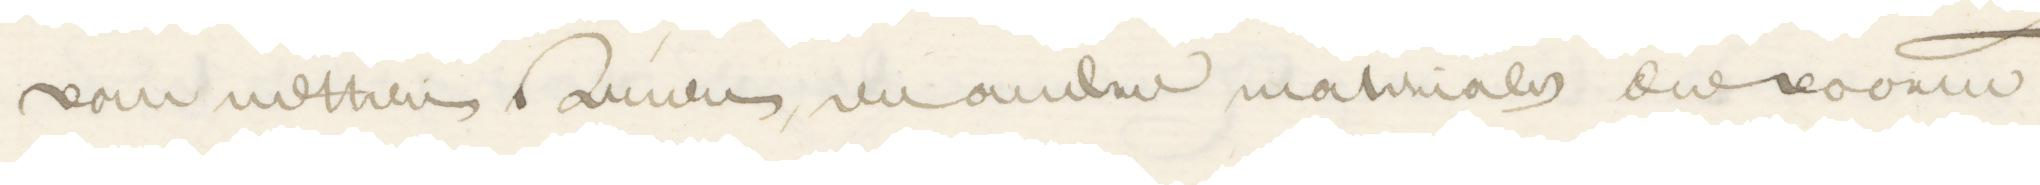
van netten stuwen en andere materialen die voorm
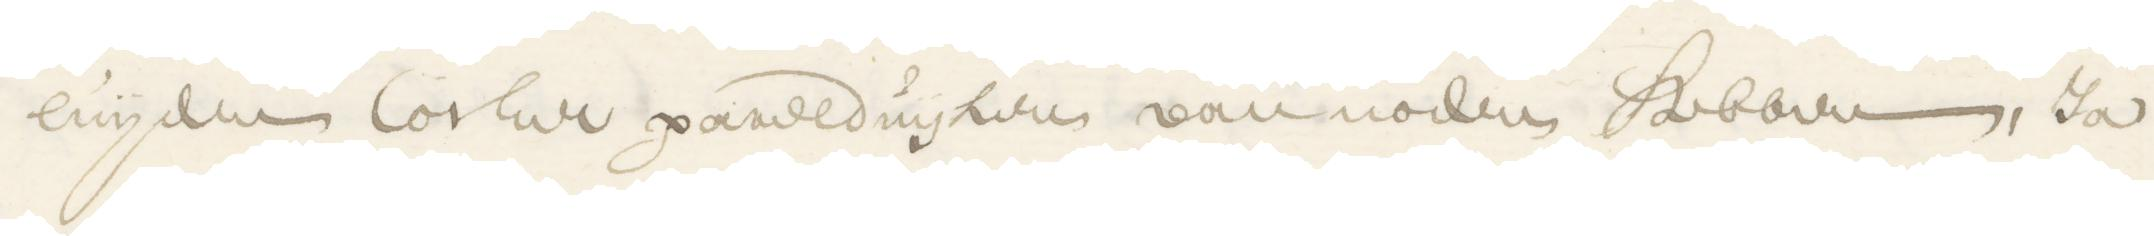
luijden tot het parelduijken van noden Hebben, Ia
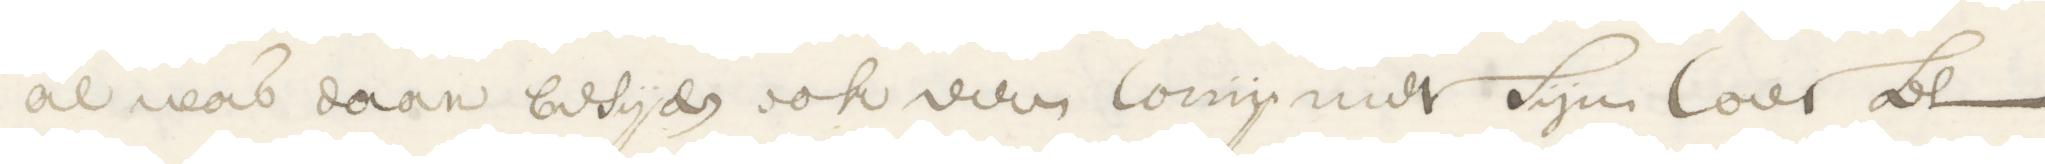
al was daar besijden ook een torij met sijn toestel
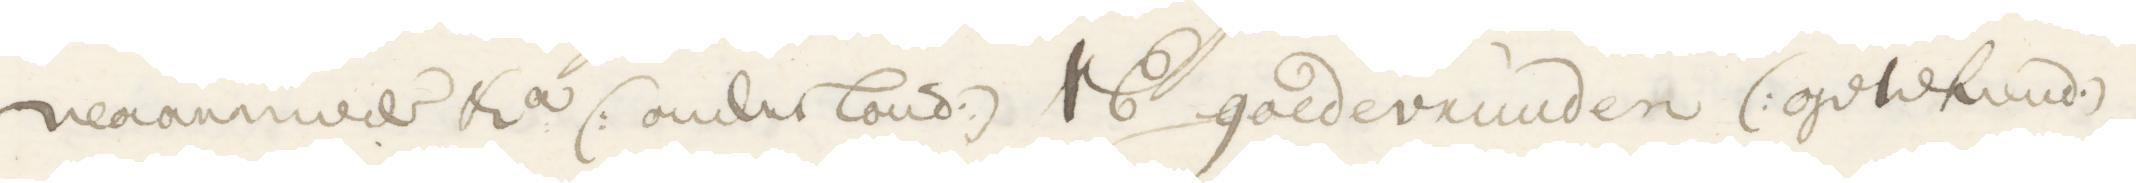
waarmede &:a /: onderstond:) UE goede vrunden (:getekend.)
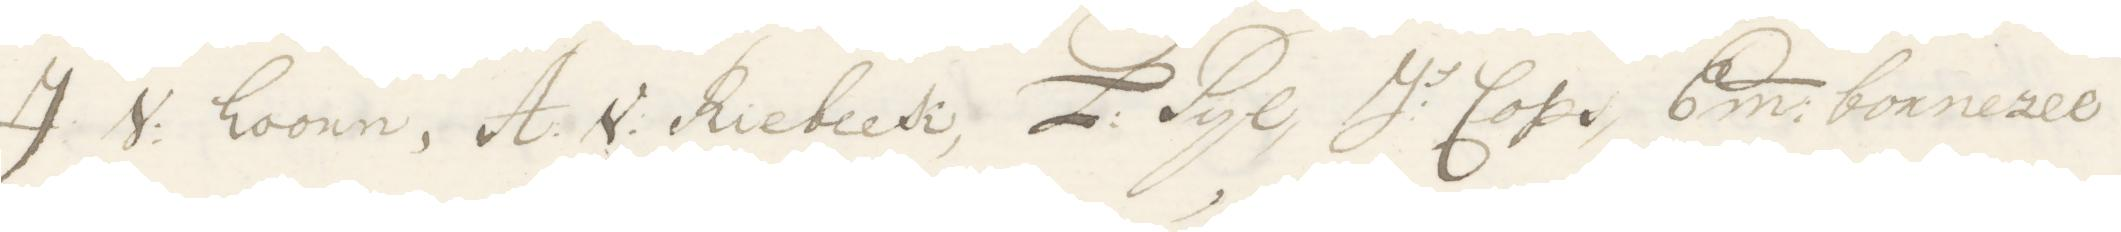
J: V: Hoorn, A: V: Riebeek, L: Pijl, J:s Cops, Em: bornezee
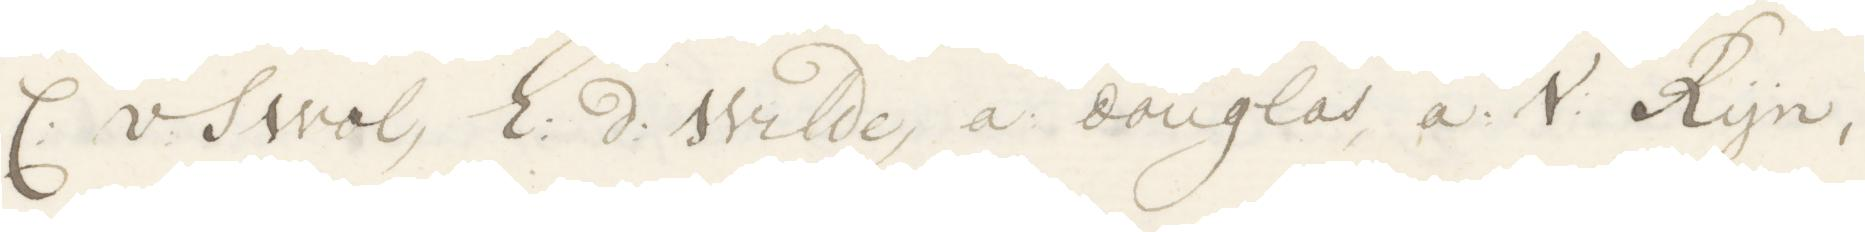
C: V. Swol, H: d: Wilde, a: Douglas, a: V: Rijn
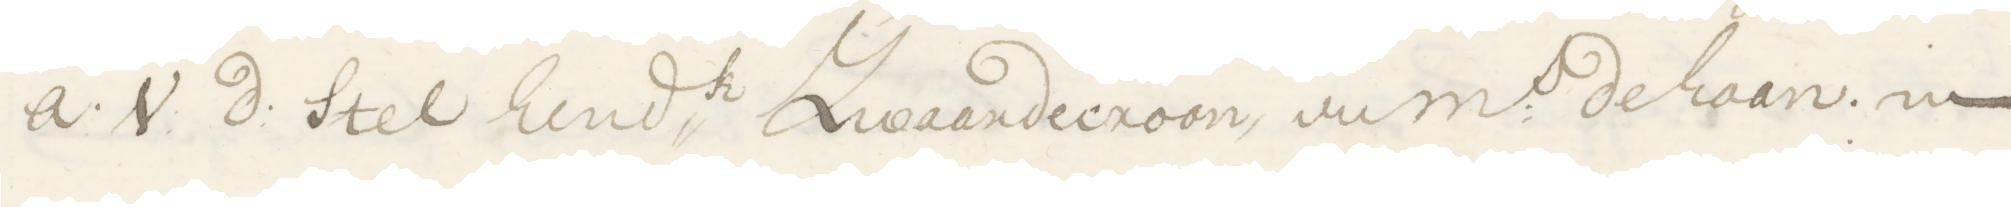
A: V: d: Stel hend„k Zwaardecroon, en m:s de haan. in
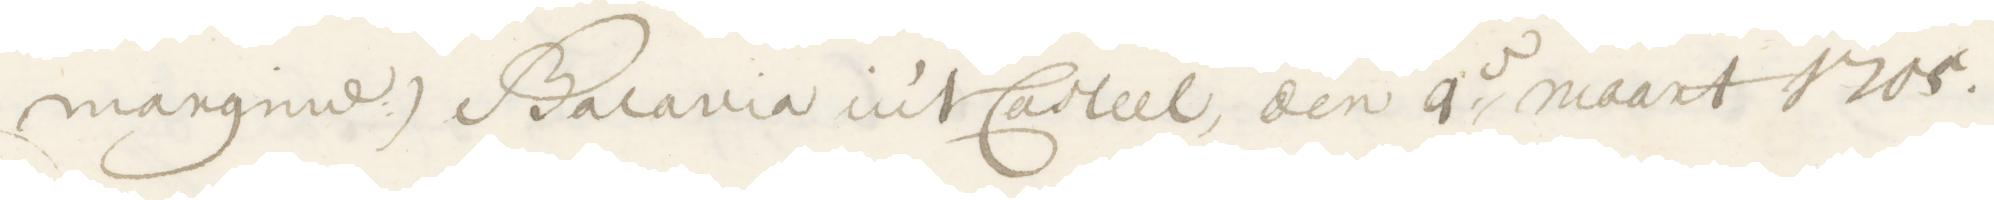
margine:) Batavia in't Casteel, den 4„e maart 1705.
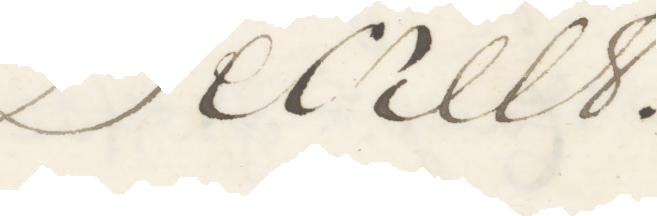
Secreet.
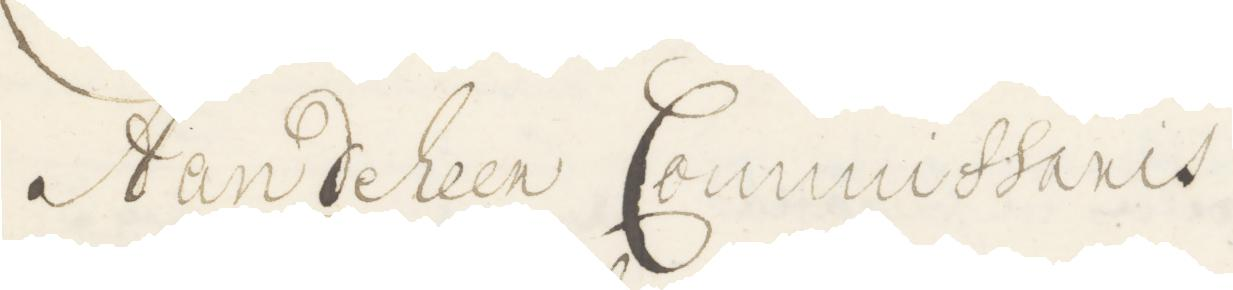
Aan de heer Commissaris
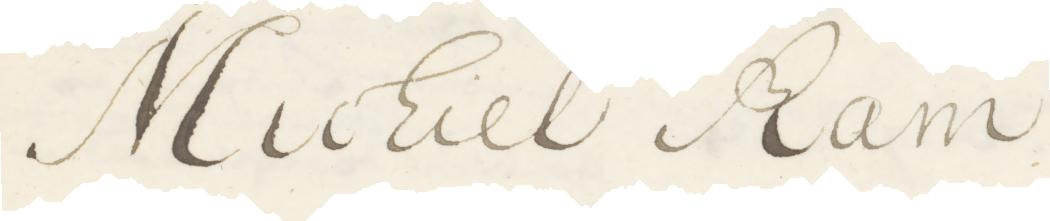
Michiel Ram
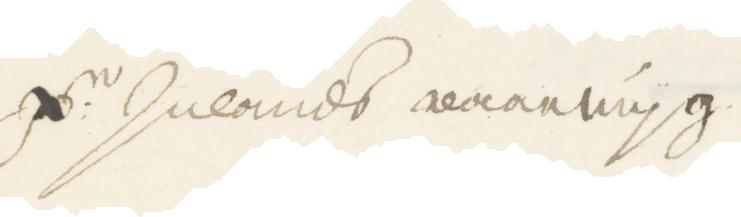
p:n Jnlands vaartuijg.
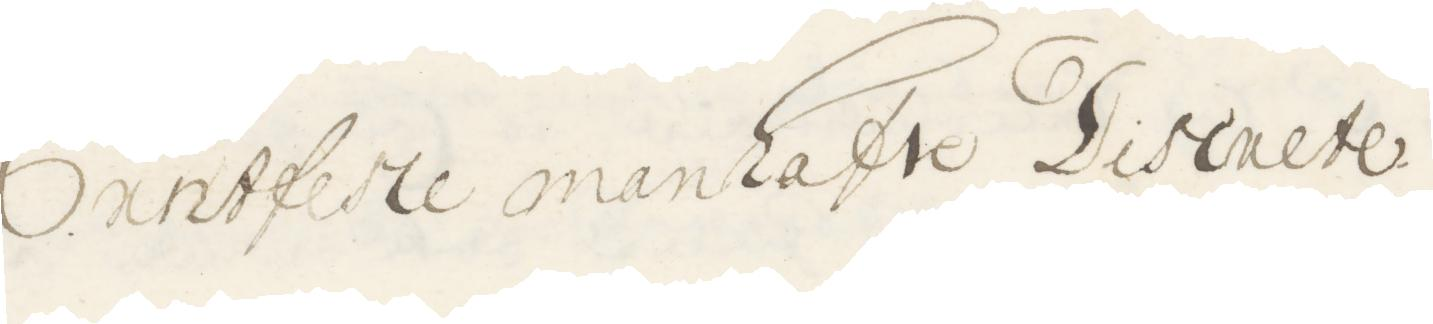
Erntfeste manhafte Discrete.
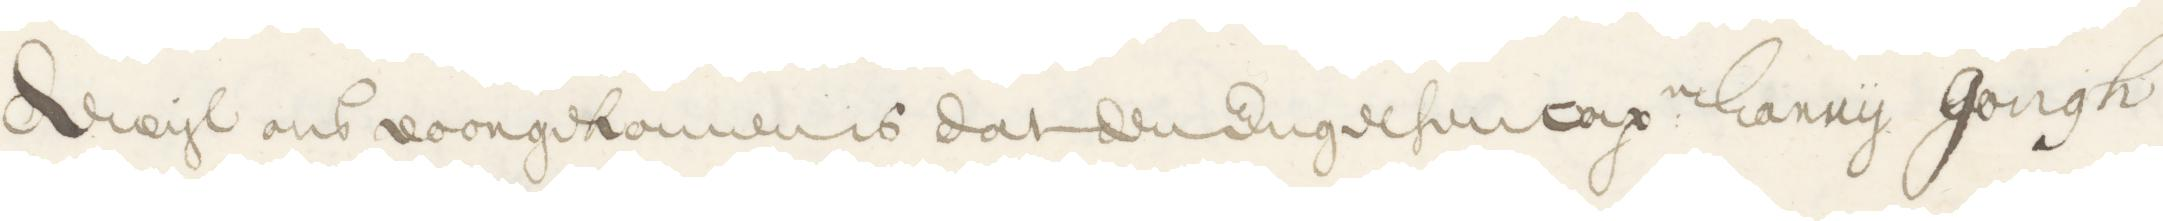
dewijl ons voorgekomen is dat den Engelsen cap:n harrij Gough
